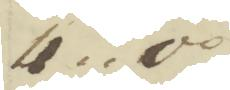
4 „ do
